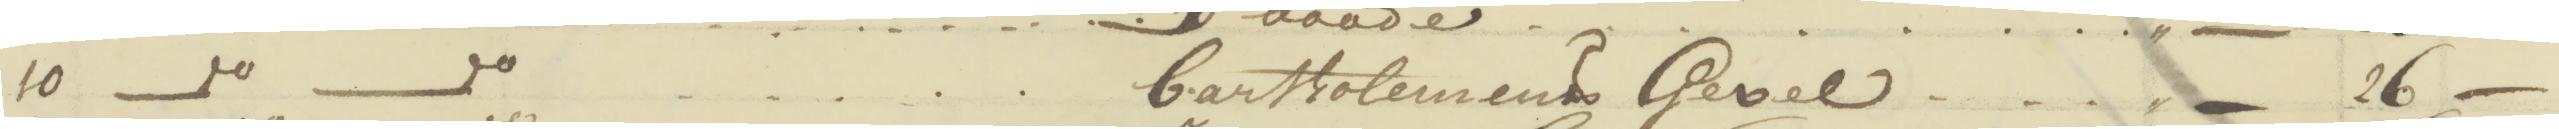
10 _o _o . . . . . . bartholemeus Gevel . . . „ — 26 —
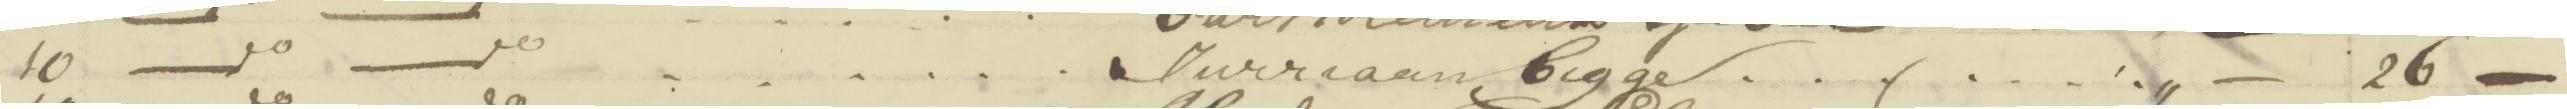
10 _o _o - - - . . . Iurriaan bigge . . . . . . . .„ — 26 —
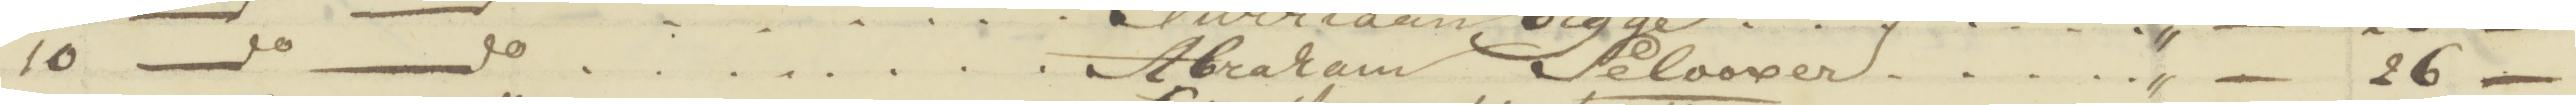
10 _o _o . . . . . . . . Abraham Seloover . . . . . „ — 26 —
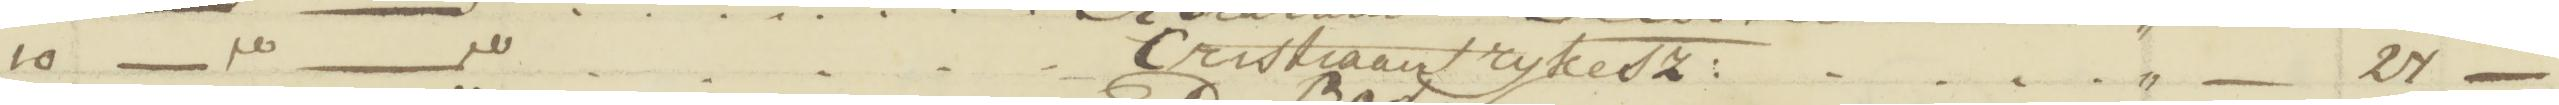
10 _o _o . . . . . Cristiaan rykesz: . . . . „ — 27 —
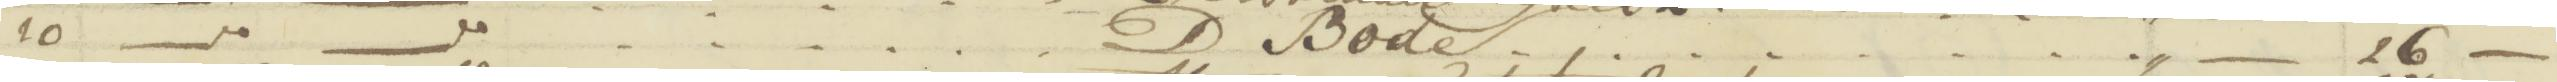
10 _o _o - - - . . . D Bode - . . . . . . .„ — 26 —
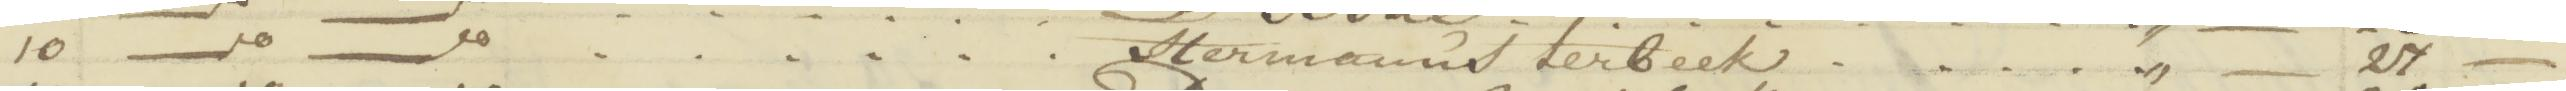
10_o _o - . - - - . Hermanus terbeek . . . . .„ — 27 —
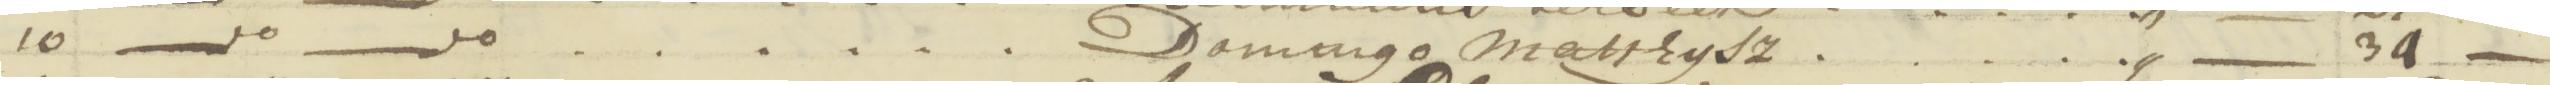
10 _o _o . . . . . . Domingo matthysz . . . . .„ — 34 —
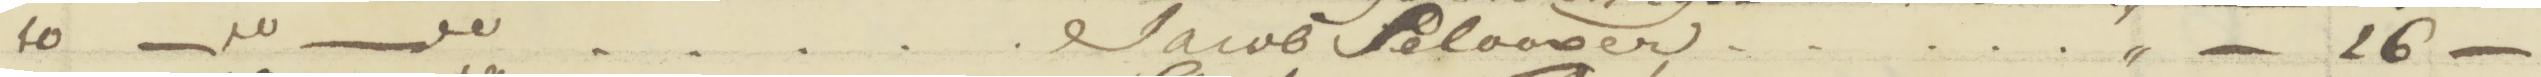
10 _o _o - - . . . Iacob Seloover - - . . . „ — 26 —
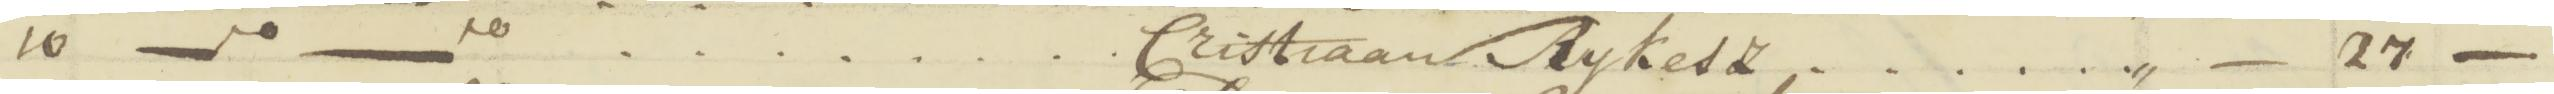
10 _o _o. . . . . . . . Cristiaan Rykesz . . . . . .„ — 27 —
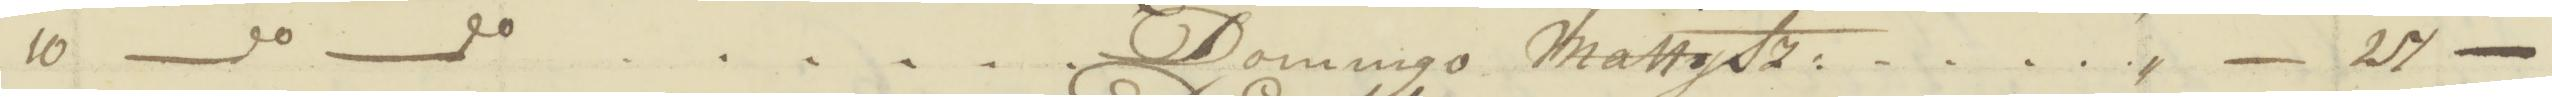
10 _o _o . . . - - . Domingo Mattysz: - . . . . „ — 27 —
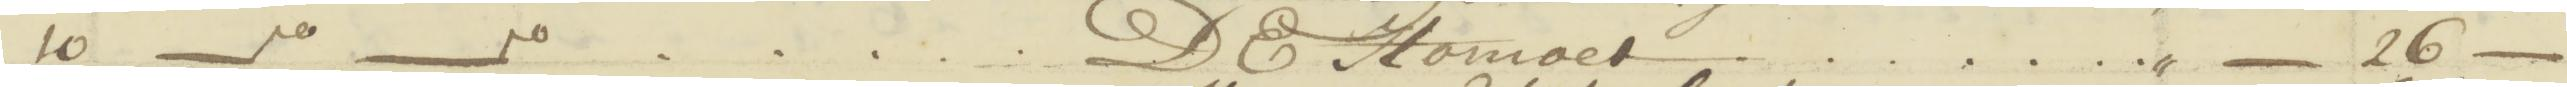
10 _o _o. . . . . D E Homoet . . . . . . . „ — 26 —
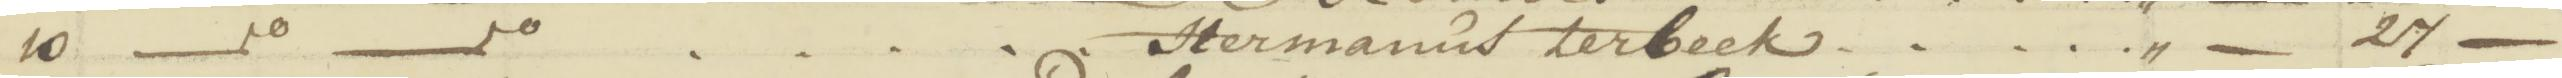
10 _o _o . - . . . Hermanus terbeek . . . . . „ — 27 —
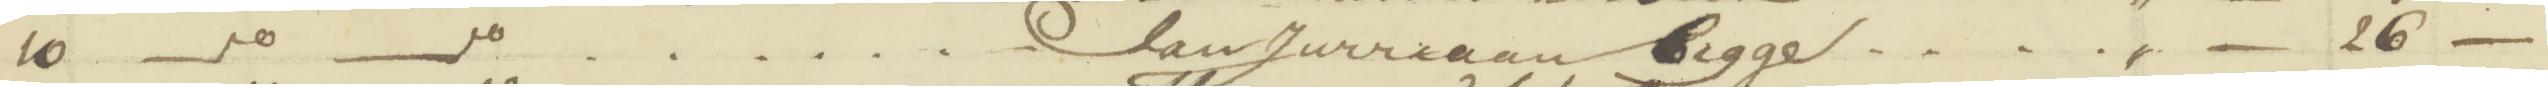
10 _o _o . . . . . . - Ian Jurriaan bigge - - - . „ — 26 —
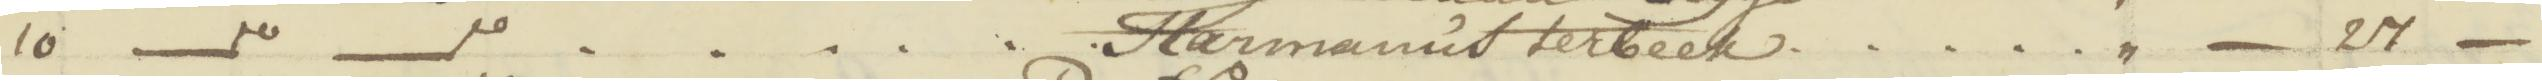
10 _o _o - - - . . .Harmanus terbeek . . . . . „ — 27 —
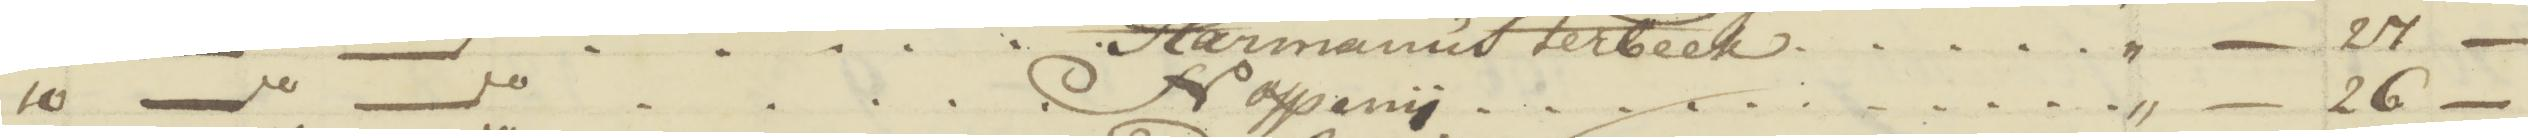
10 _o _o - . . . .Noppenij . . . . . . - - . . . „ — 26 —
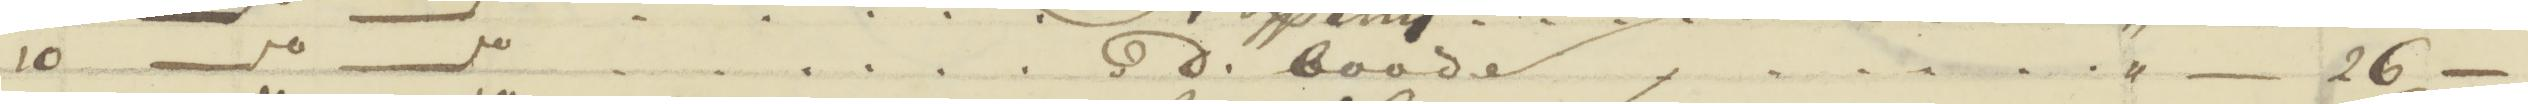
10 _o _o - . . . . . . d: boode - - . . . „ — 26 —
